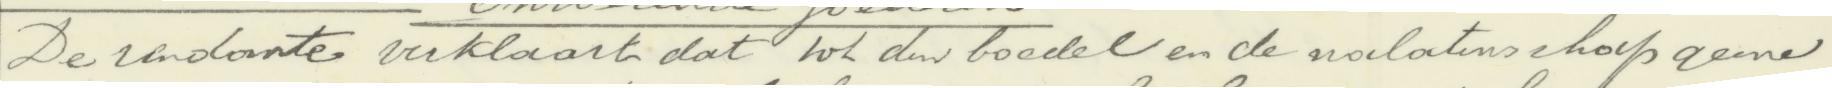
De rendante verklaart dat tot den boedel en de nalatenschap geene
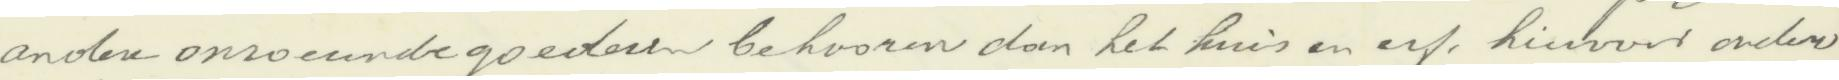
andere onroerende goederen behooren dan het huis en erf, hiervoor onder
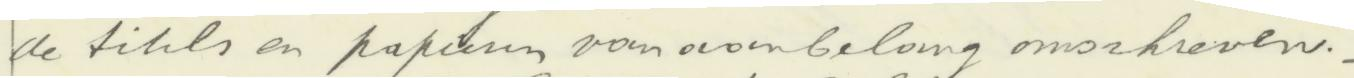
de titels en papieren van aanbelang omschreven.
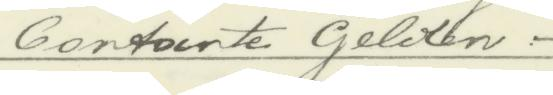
Contante Gelden:
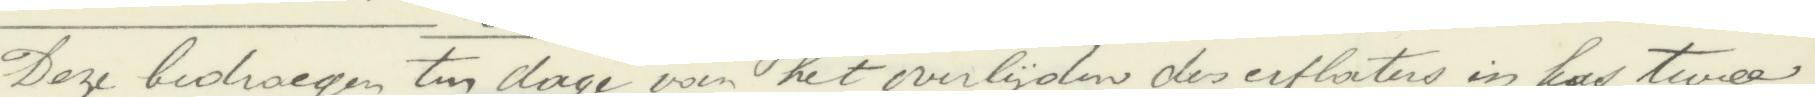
Deze bedroegen ten dage van het overlijden des erflaters in kas twee
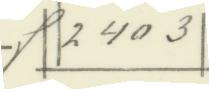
ƒ 2403
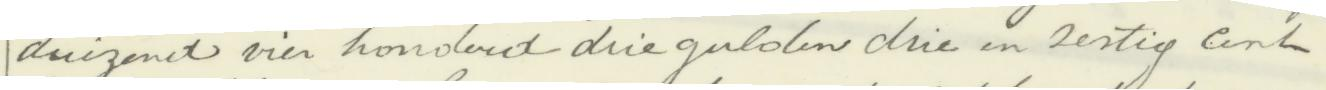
duizend vier honderd drie gulden drie en zestig cent
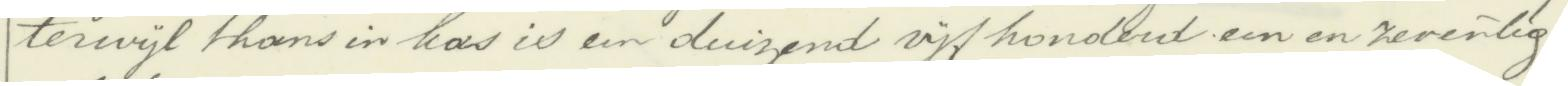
terwijl thans in kas is een duizend vijf honderd een en zeventig
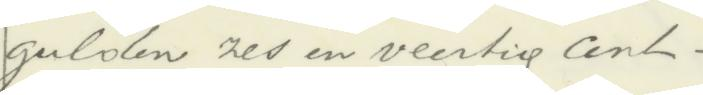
gulden zes en veertig cent
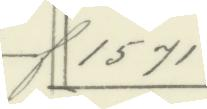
ƒ 1571
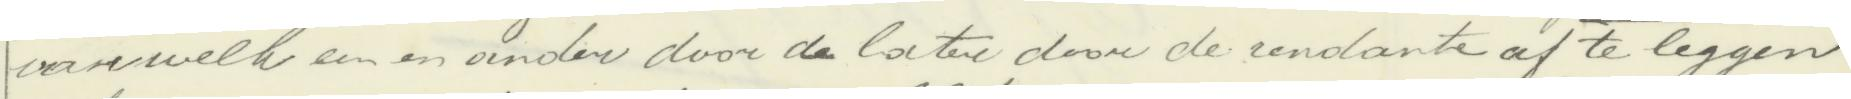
van welk een en ander door de later door de rendante af te leggen
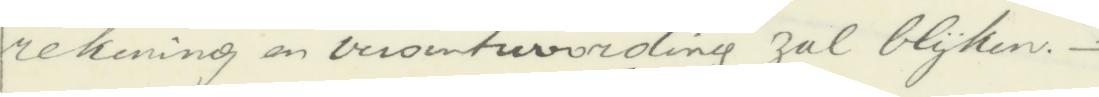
rekening en verantwoording zal blijken.
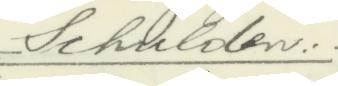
Schulden:
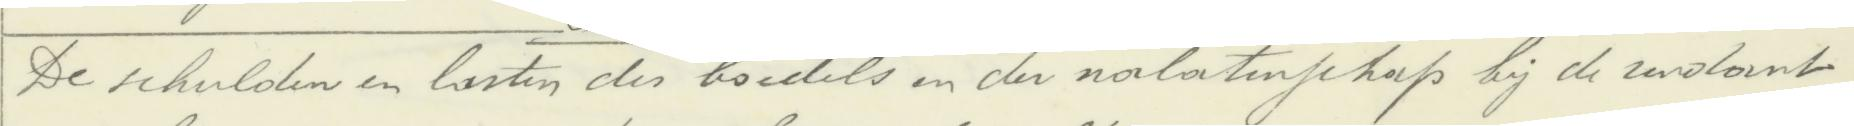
De schulden en lasten des boedels en der nalatenschap hij de rendant
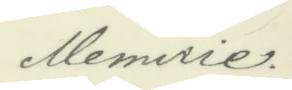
Memorie.
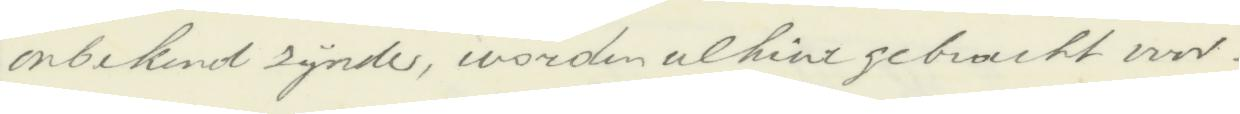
onbekend zijnde, worden alhier gebracht voor
